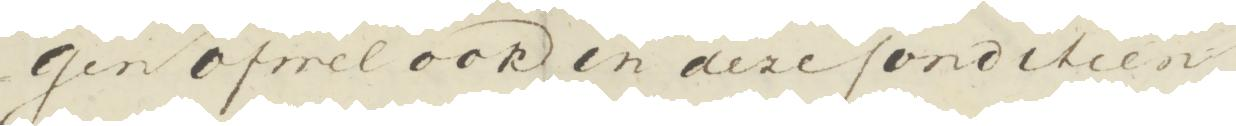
„gen ofwel ook in deze Conditien
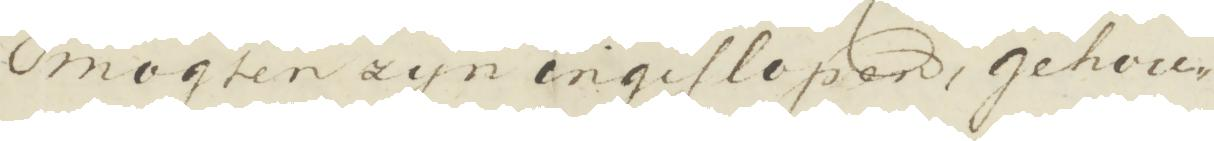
mogten zyn ingeslopen, gehou„
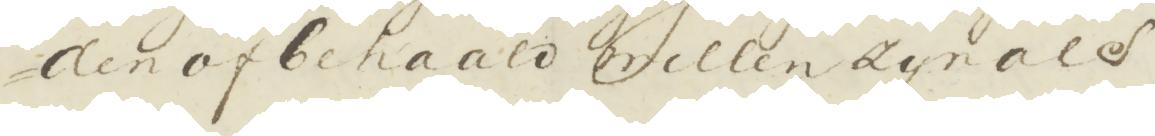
=den of behaald willen zyn als
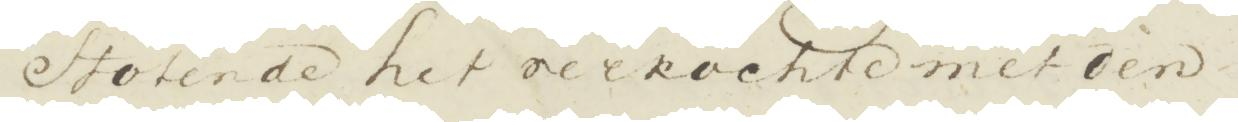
Stotende het verkochte met den
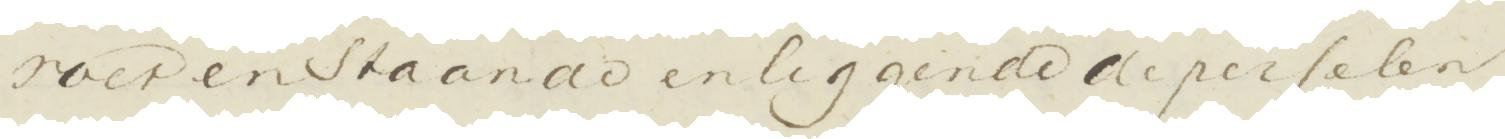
voet en staande en leggende de percelen
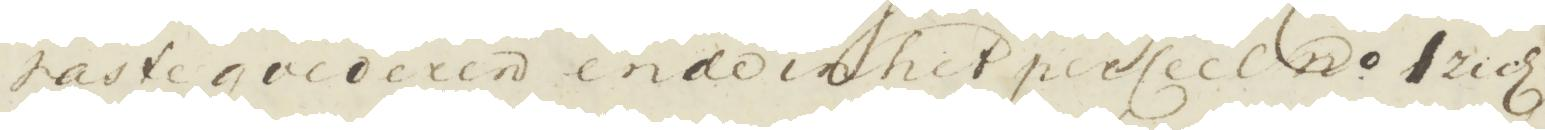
vaste goederen en de in het perceel n:o 1 zich
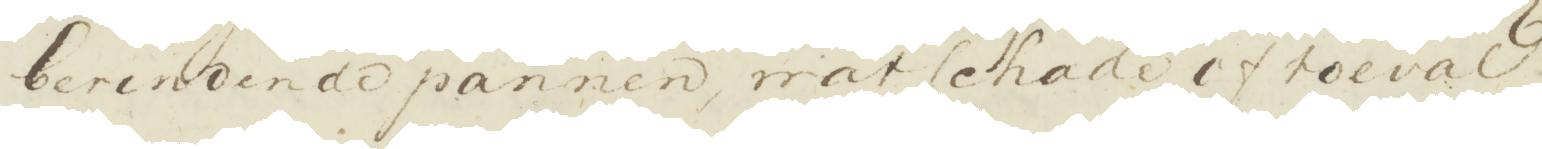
bevindende pannen, wat schade of toeval
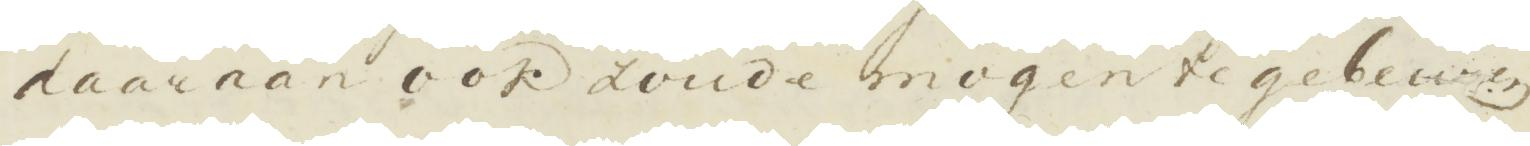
daaraan ook zoude mogen te gebeuren
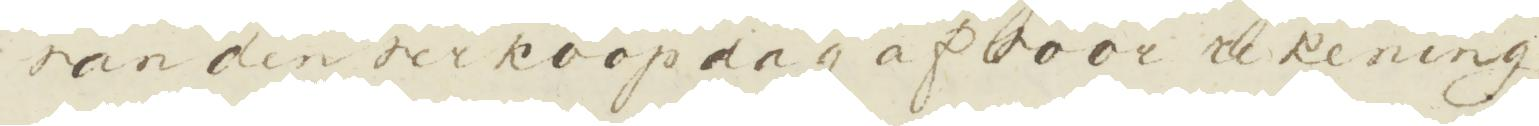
van den verkoopdag af voor rekening
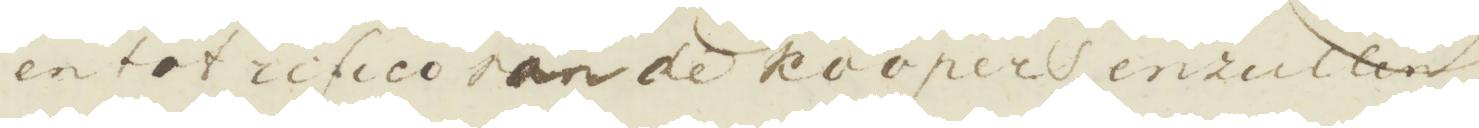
en tot refico van de koopers en zullen
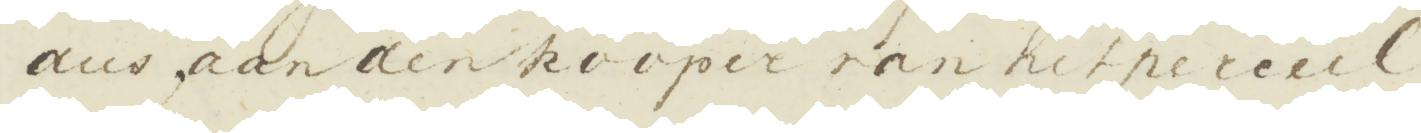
dus, aan den kooper van het perceel
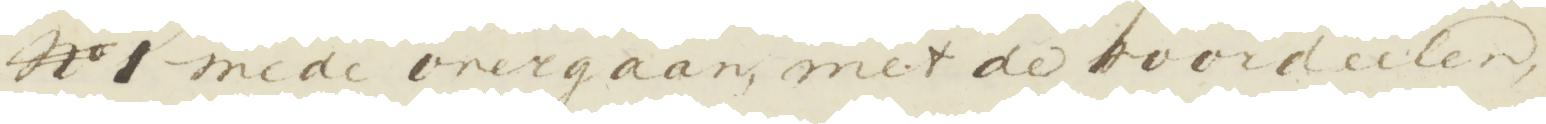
N:o 1 mede overgaan, met de voordeelen,
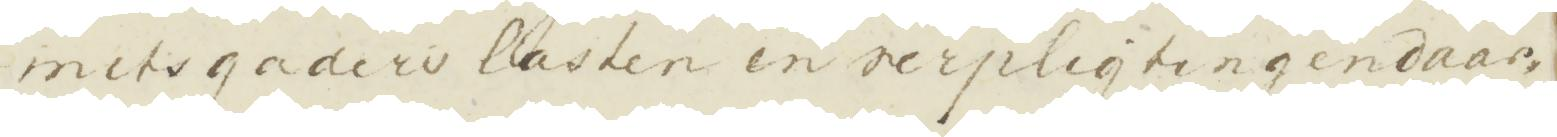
mitsgaders lasten en verpligtingen daar„
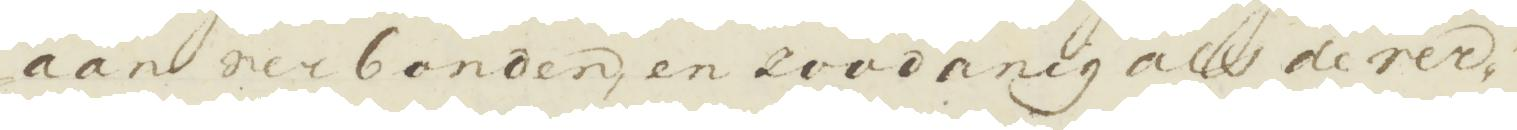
„aan verbonden, en zoodanig als de ver„
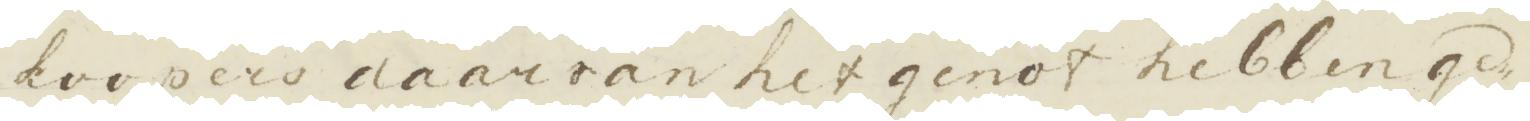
koopers daarvan het genot hebben ge
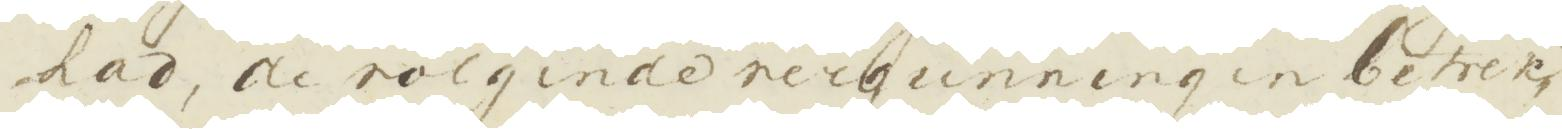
„had, de volgende vergunning en betrek„
